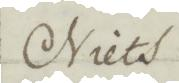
Niets
